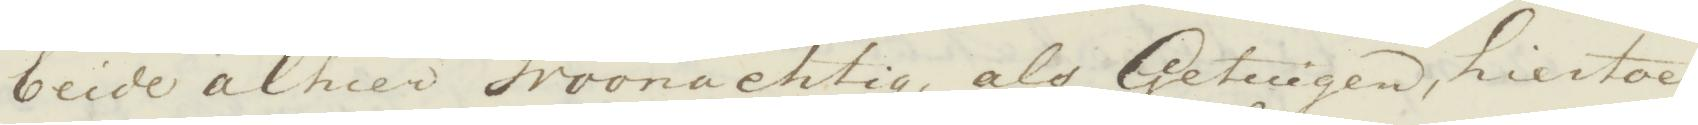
beide alhier woonachtig, als Getuigen, hiertoe
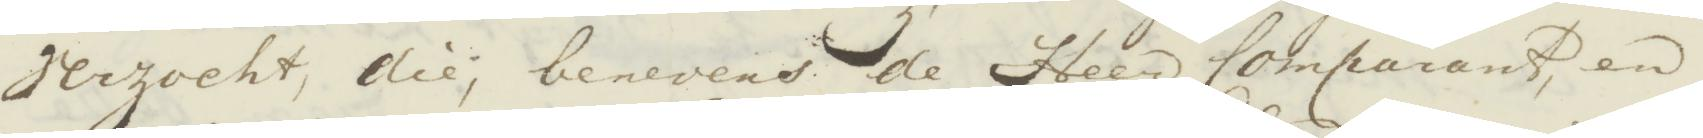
Verzocht, die, benevens. de Heer Comparant, en
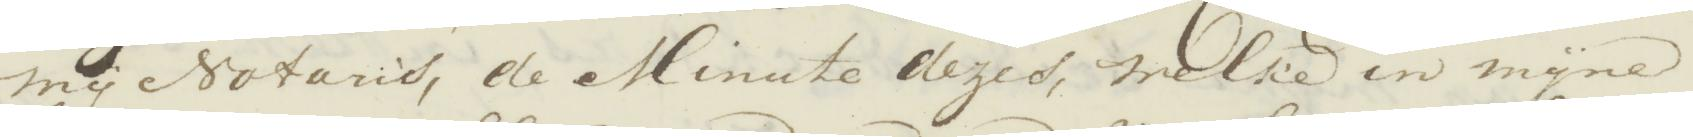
mij Notaris, de Minute dezes, welke in mijne
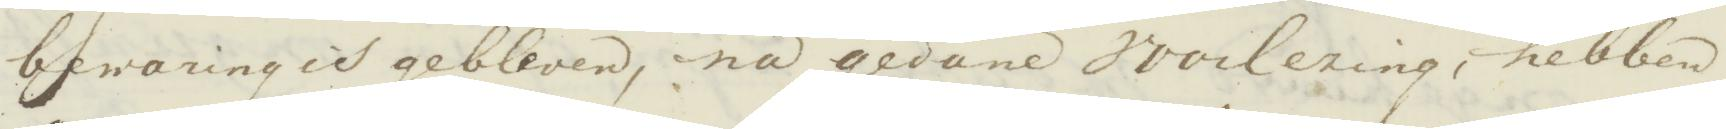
bewaring is gebleven, na gedane voorlezing; hebben
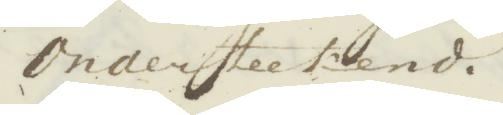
Onderteekend.
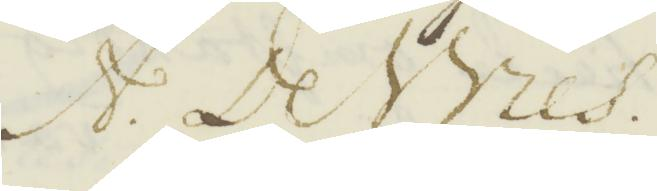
A: De Vries.
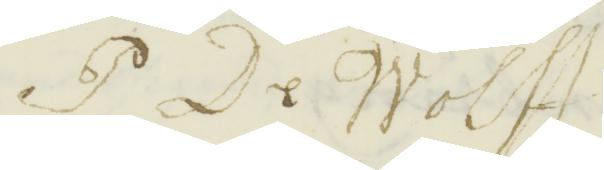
P De Wolf
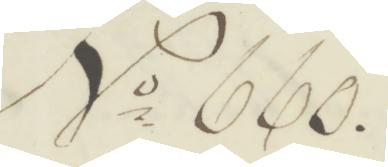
N=o 660.
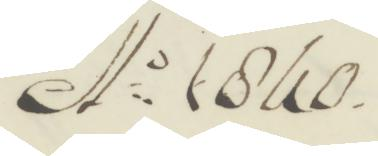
A=o 1840.
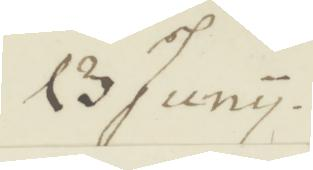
13 Junij.
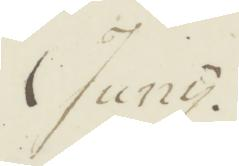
1 Junij:
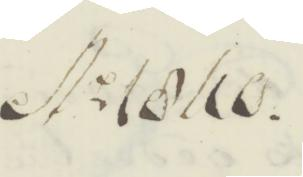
A:o 1840.
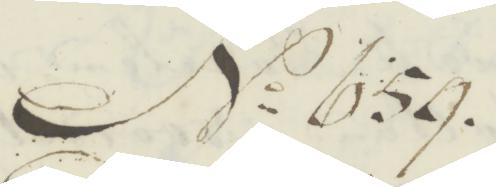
N=o 659.
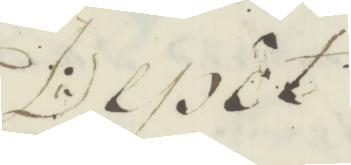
Depôt
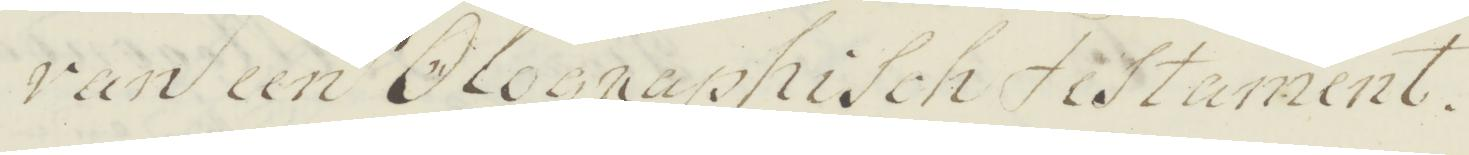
van een Olographisch testament.
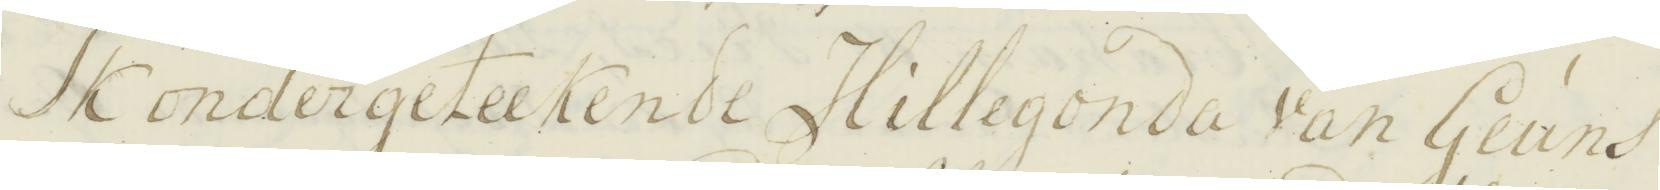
Ik ondergeteekende Hillegonda van Geuns
